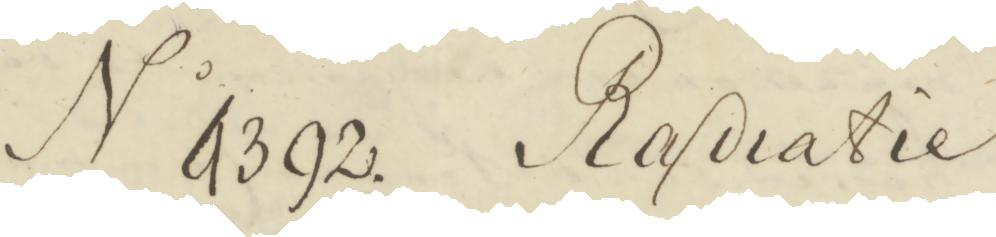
N:o 4392. Radiatie
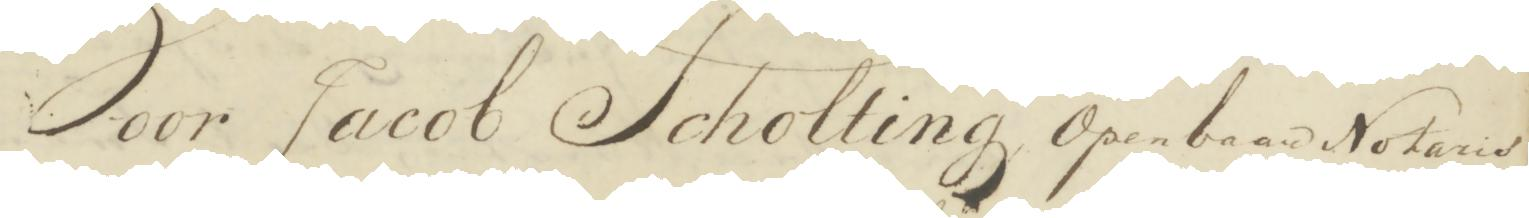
Voor Jacob Scholting Openbaar Notaris
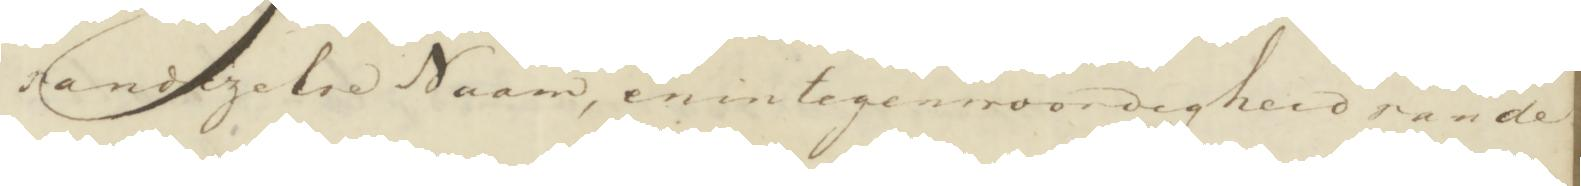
van dezelve Naam, en in tegenwoordigheid van de
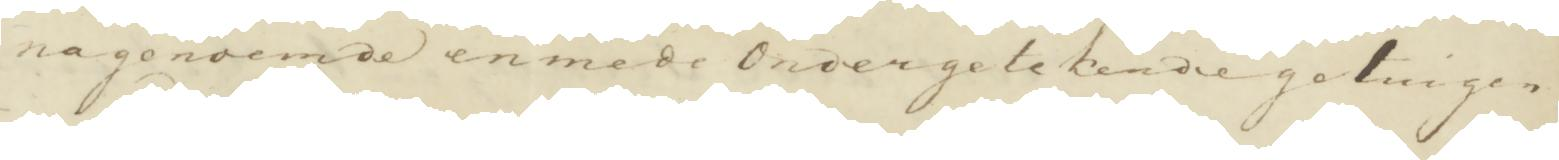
nagenoemde en mede Ondergetekende getuigen
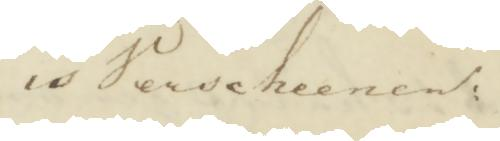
is Verscheenen:
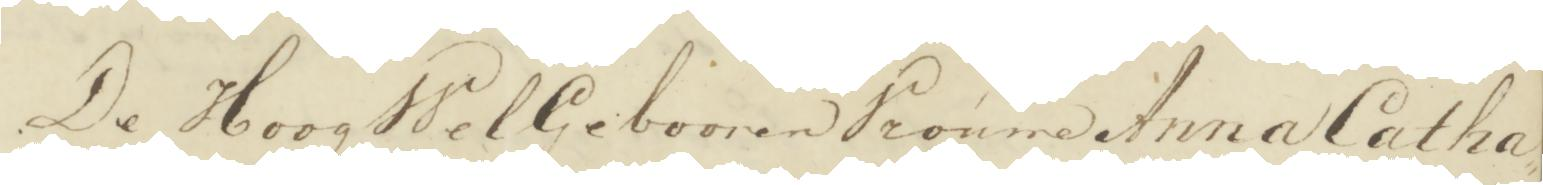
De Hoog Wel Gebooren Vrouwe Anna Catha„
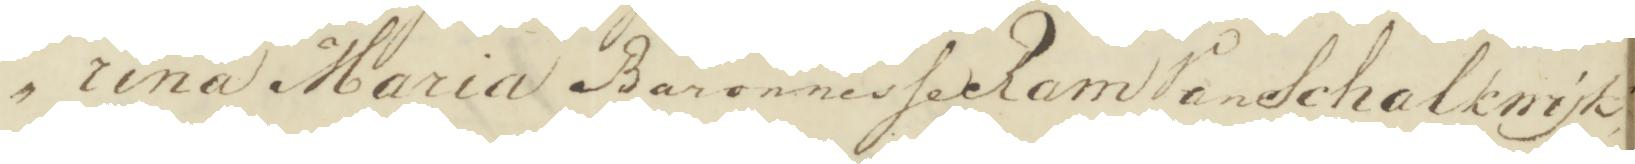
„ rina Maria Baronnesse Ram Van Schalkwijk,
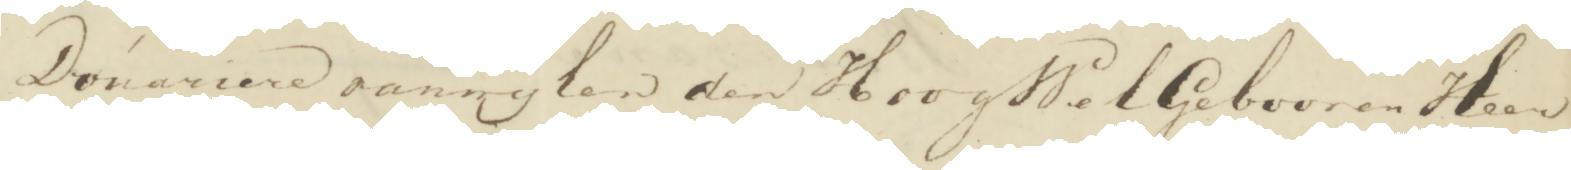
Douariere van wijlen den Hoog Wel Gebooren Heer
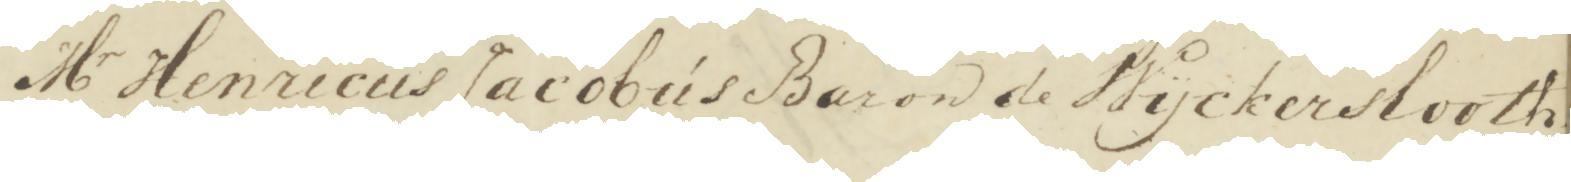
M:r Henricus Jacobus Baron de Wijckerslooth
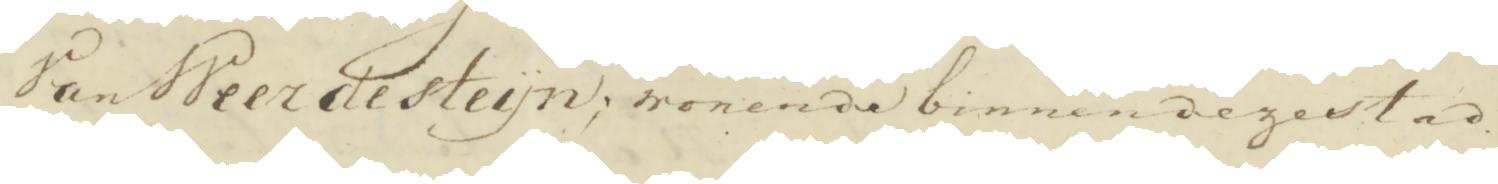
Van Weerdesteijn; wonende binnen deze stad.
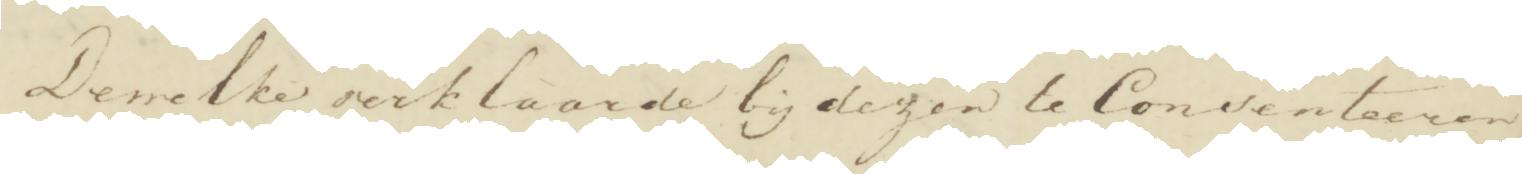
De welke verklaarde bij dezen te Consenteeren
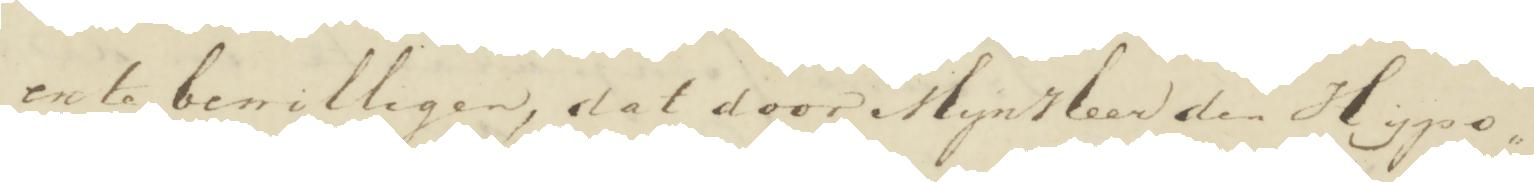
en te bewilligen, dat door Myn Heer den Hijpo„
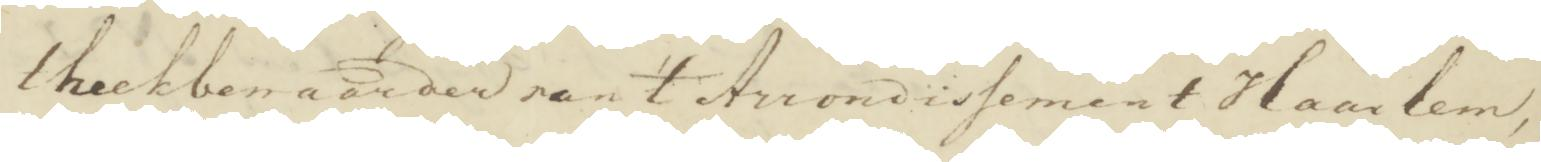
theekbewaarder van ’t Arrondissement Haarlem,
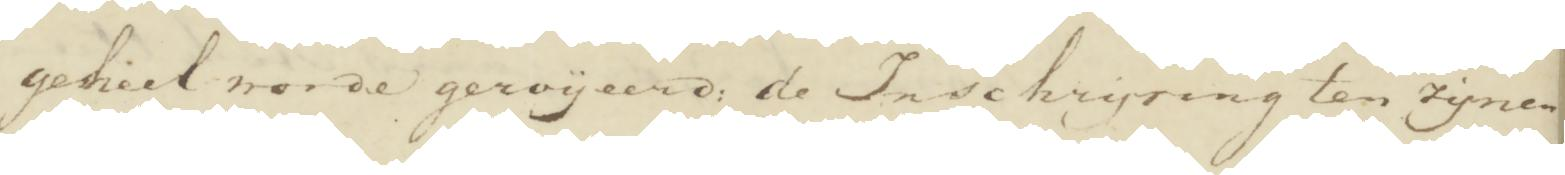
geheel worde geroijeerd: de Inschrijving ten zijnen
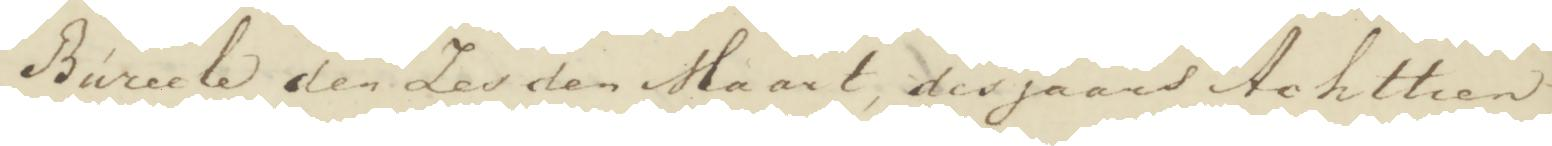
Bureele den Zesden Maart, des jaars Achttien
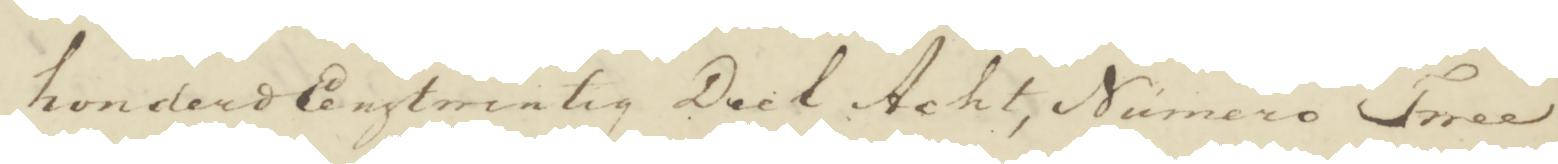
honderd Eenentwintig Deel Acht, Numero Twee
